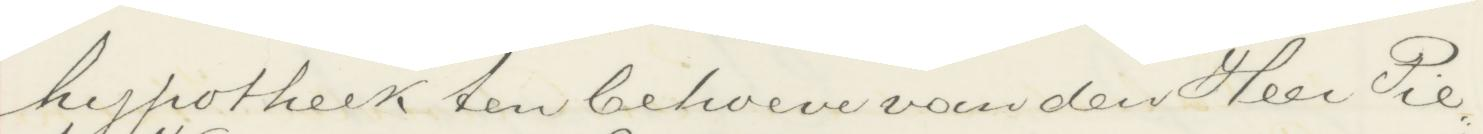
hypotheek ten behoeve van den Heer Pie„
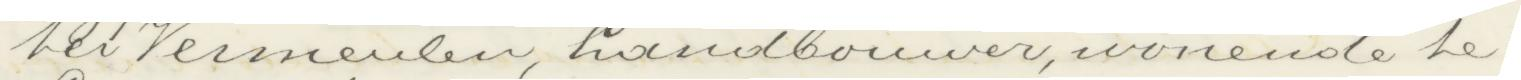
ter Vermeulen, landbouwer, wonende te
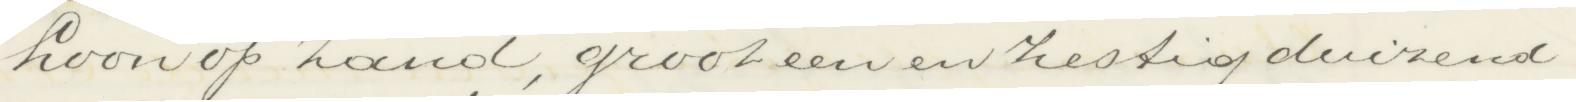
Loon op Zand, groot een en zestig duizend
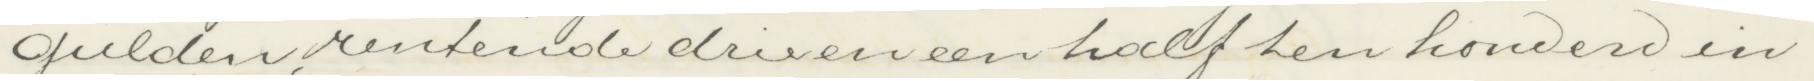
gulden, rentende drie en een half ten honderd in
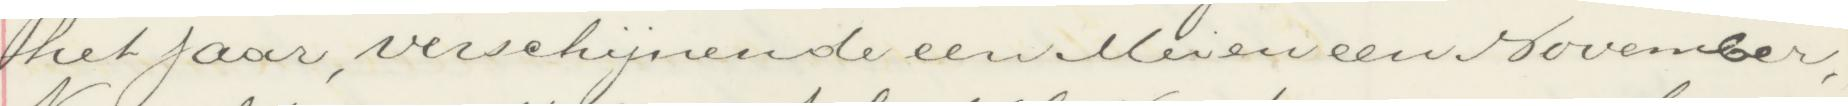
het Jaar verschijnende een Mei en een November,
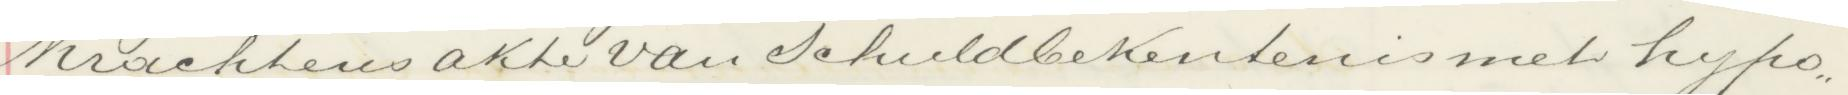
Krachtens akte van schuldbekentenis met hypo„
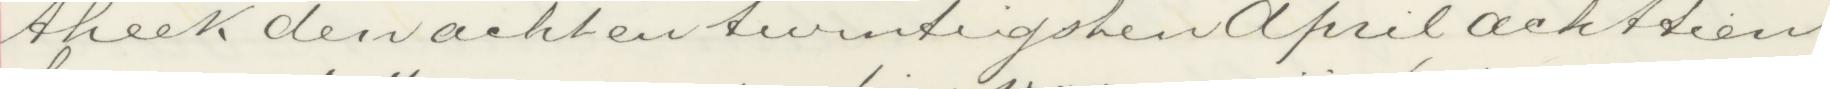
theek den acht en twintigsten April achttien
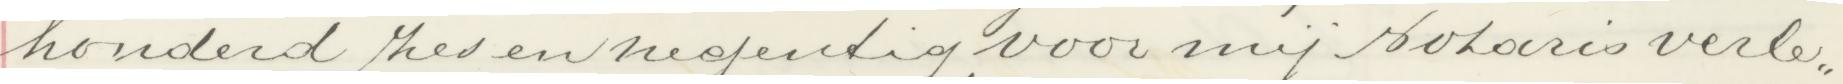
honderd zes en negentig voor mij Notaris verle„
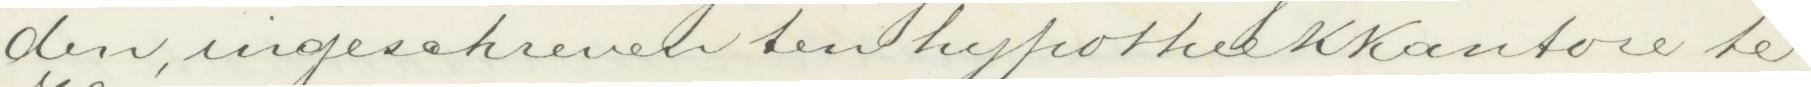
den, ingeschreven ten hypotheekkantore te
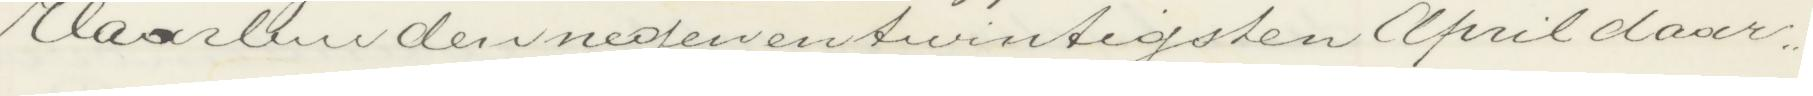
Haarlem den negen en twintigsten April daar„
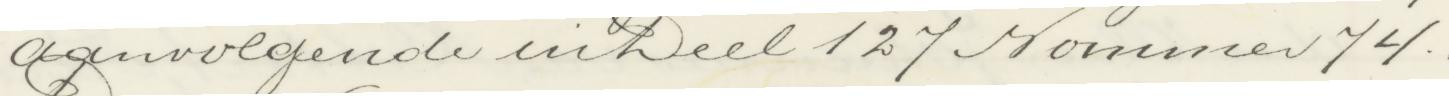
aanvolgende in Deel 127 Nommer 74.
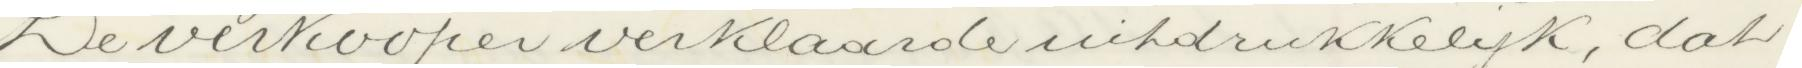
De verkooper verklaarde uitdrukkelijk, dat
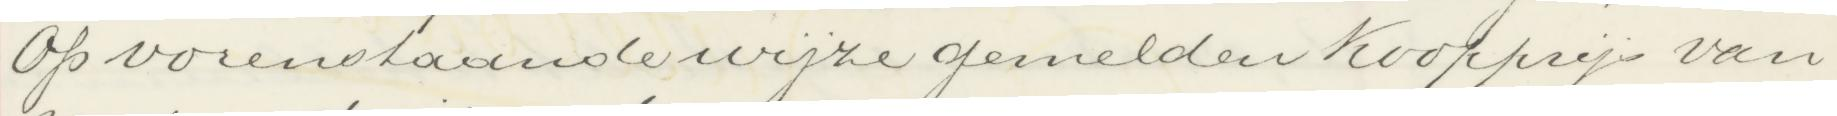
op vorenstaande wijze gemelden koopprijs van
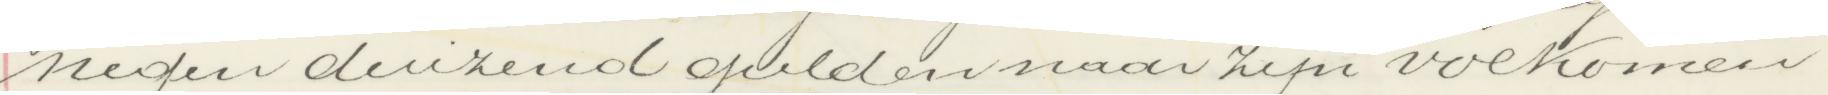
negen duizend gulden naar zijn volkomen
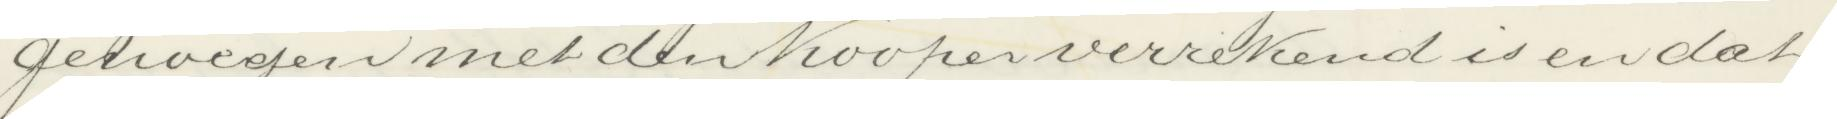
genoegen met den kooper verrekend is en dat
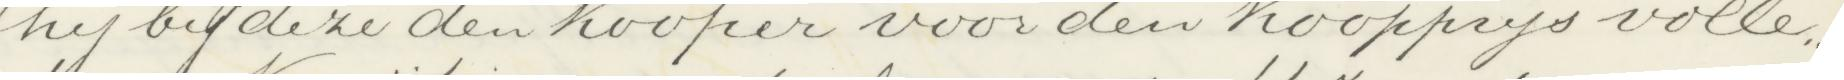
hij bij deze den kooper voor den Koopprijs volle„
